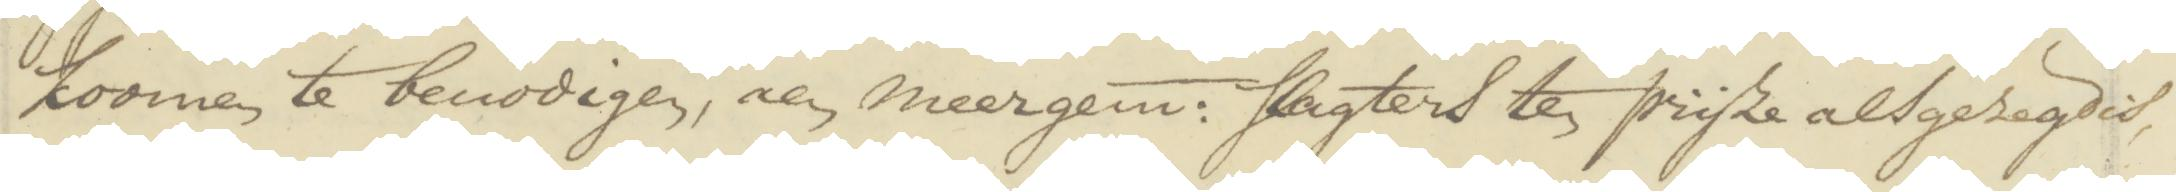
koomen te benodigen, aen meergem: slagters ten prijze als gezegd is,
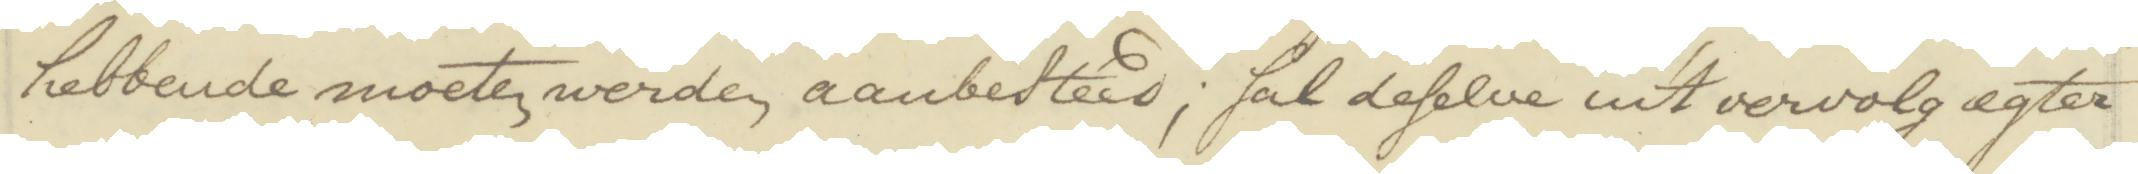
hebbende moeten werden aanbesteed; sal deselve in’t vervolg egter
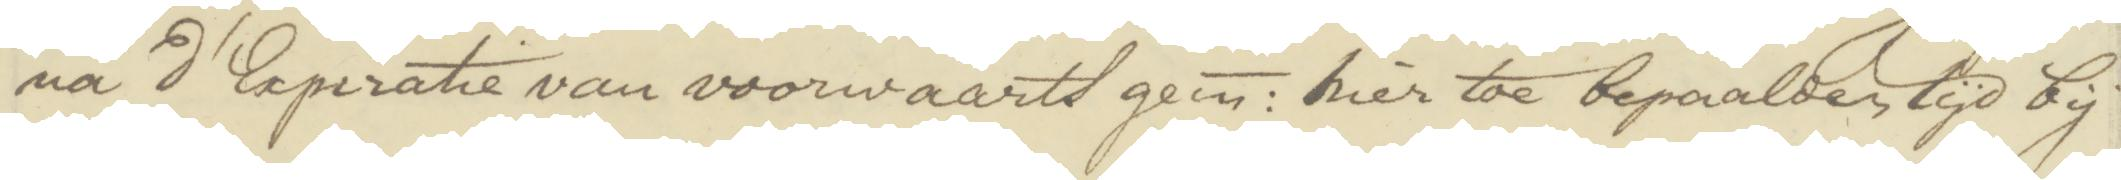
na d’Expiratie van voorwaarts gem: hier toe bepaalden tijd bij
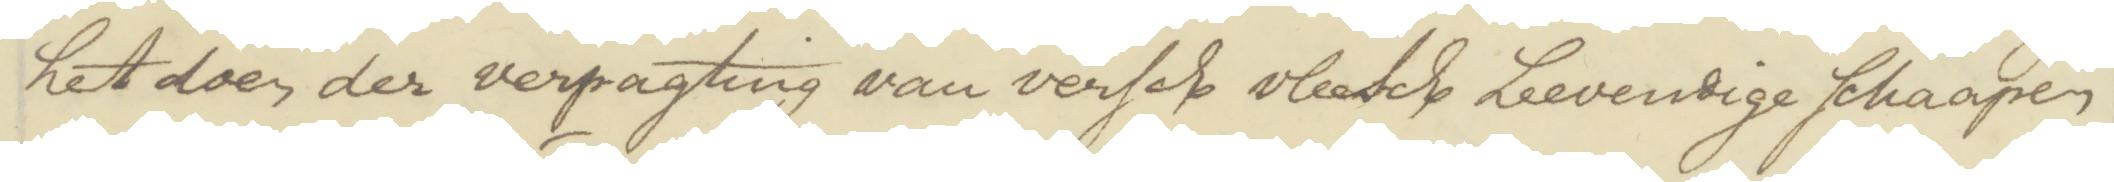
het doen der verpagting van versch vleesch Leevendige schaapen
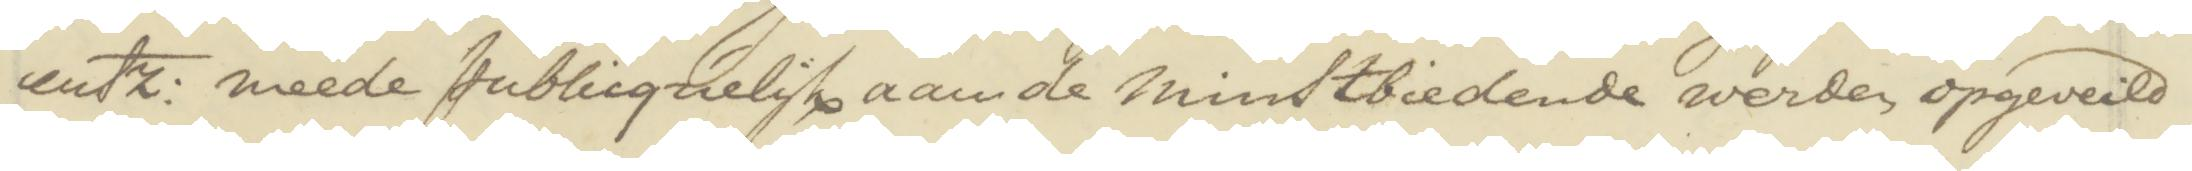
ensz: meede publicquelijk aan de minstbiedende werden opgeveild
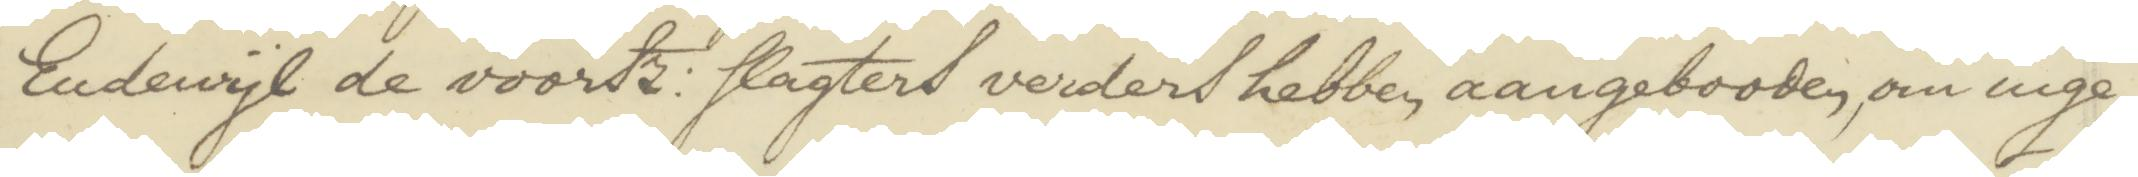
Endewijl de voorsz: slagters verders hebben aangebooden, om inge
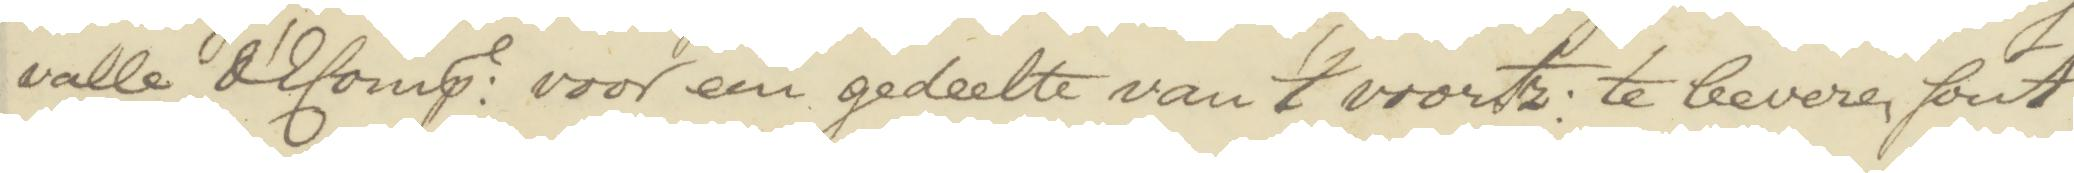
valle d'EComp:e voor een gedeelte van ’t voorsz: te leveren sout
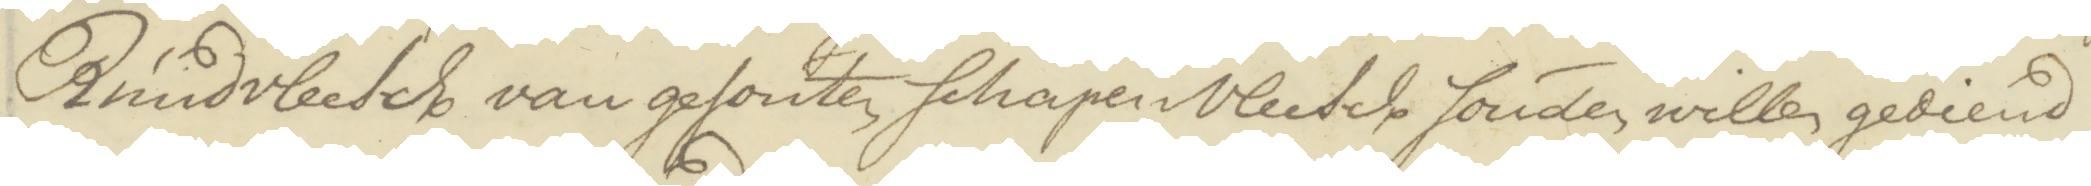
Rundvleesch van gesouten schapen vleesch souden willen gediend
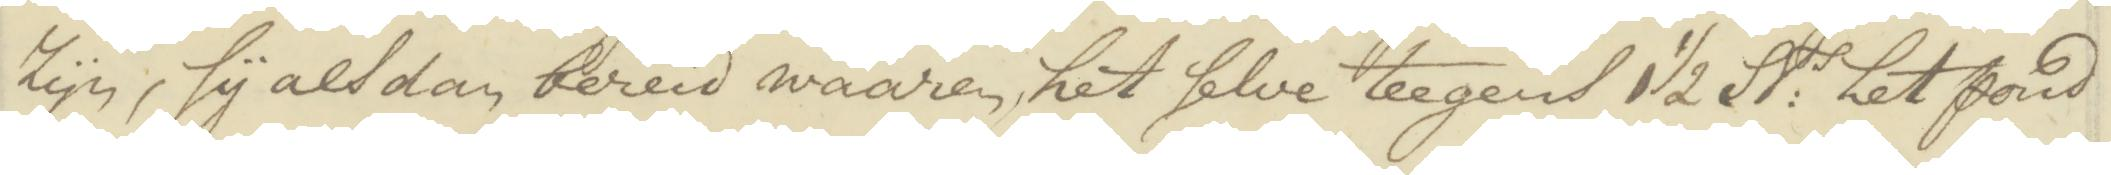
zijn, sij als dan bereid waaren het selve teegens 1½ st:s het pond
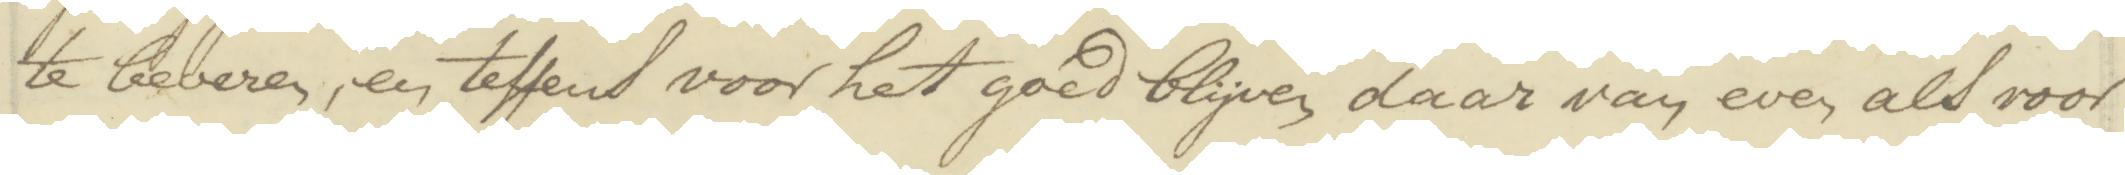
te leeveren, en teffens voor het goed blijven daar van even als voor
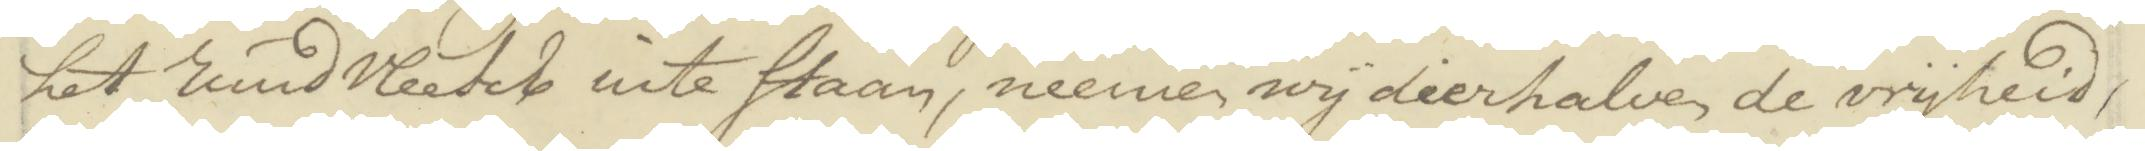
het rund vleesch uite staan, neemen wij dierhalve de vrijheid,
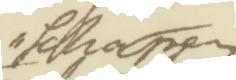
„schapen
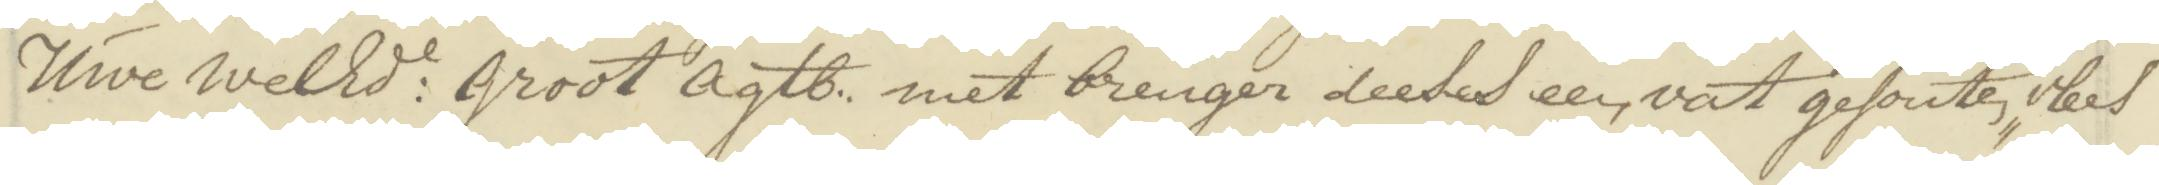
Uwe welEd:e groot agtb: met brenger deeses een vat gesouten„ vlees
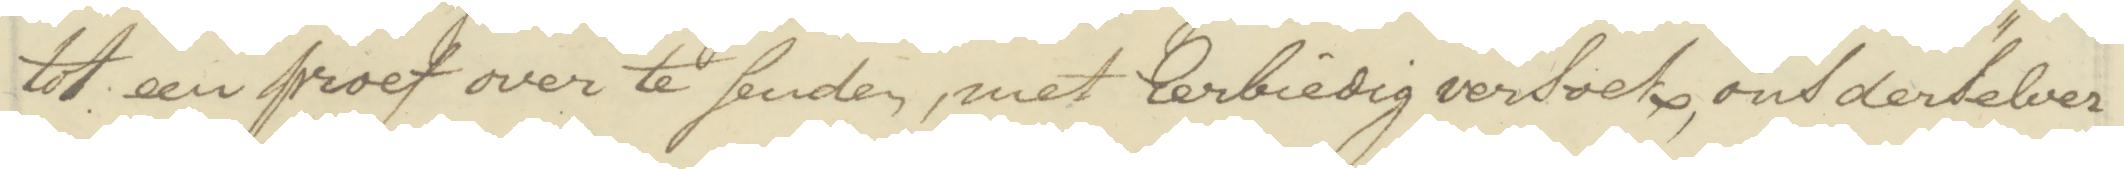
tot een proef over te senden, met Eerbiedig versoek, ons derselver
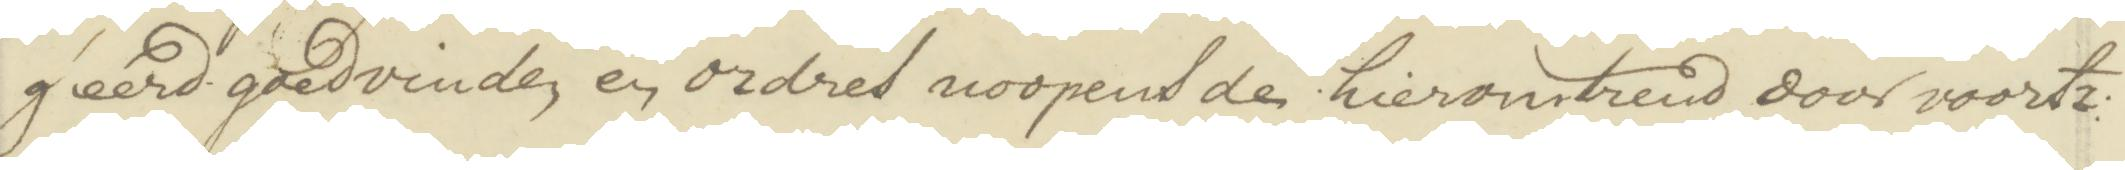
g’eerd goedvinden en ordres noopens den hieromtrend door voorsz:
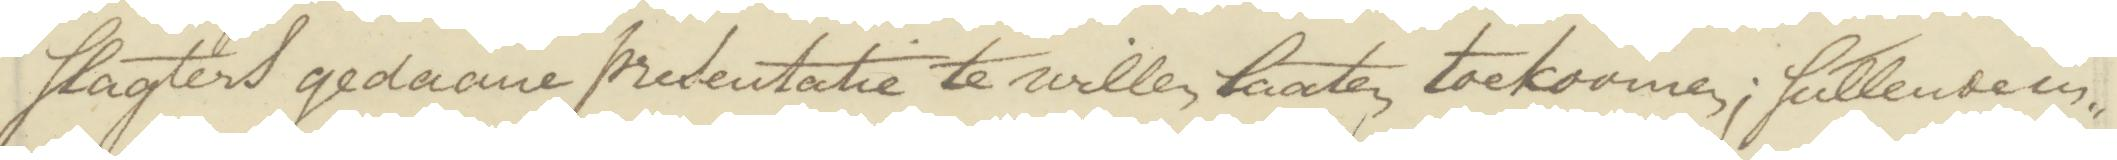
slagters gedaane presentatie te willen laaten toekoomen; sullende in„
